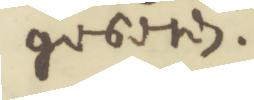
geseten.
